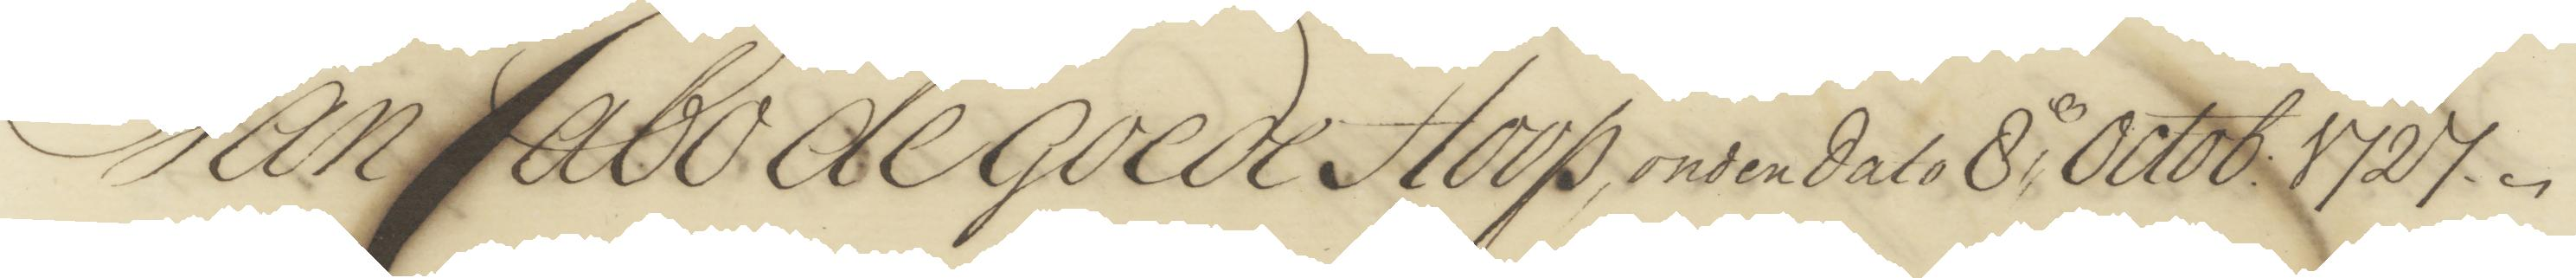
Van Cabo de goede Hoop, onder dato 8„e octob: 1727. —
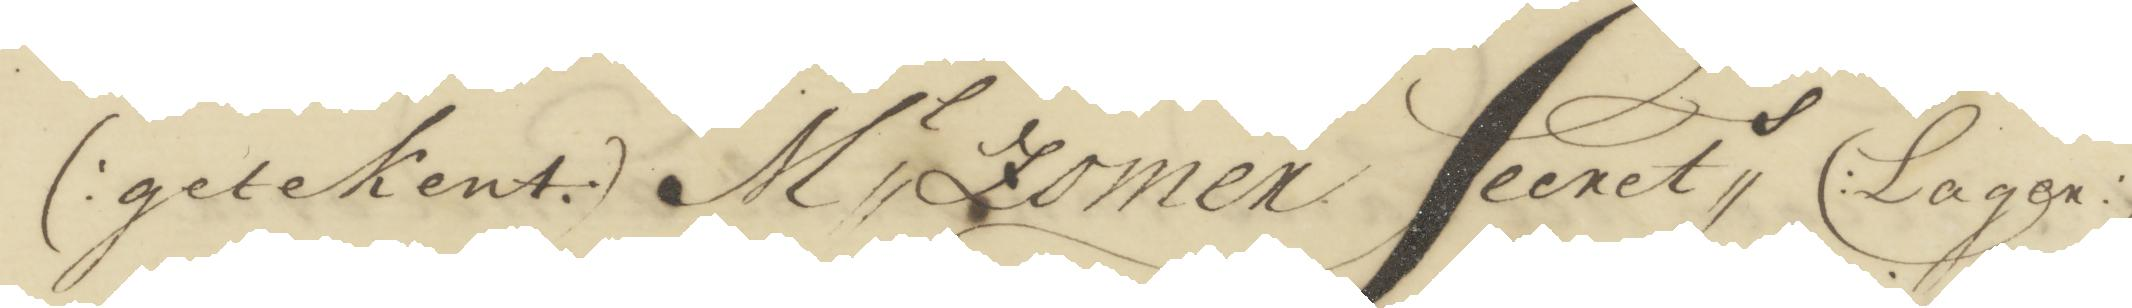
(:getekent:) M„l zomer Secret„s (Lager:
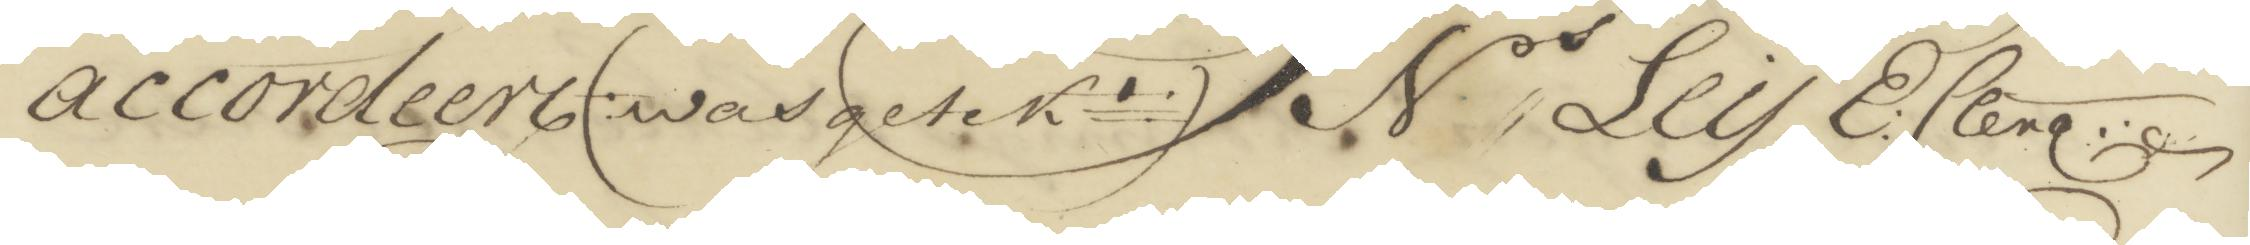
accordeert (:was getek=t:) N„s Leij E: Clerq: —
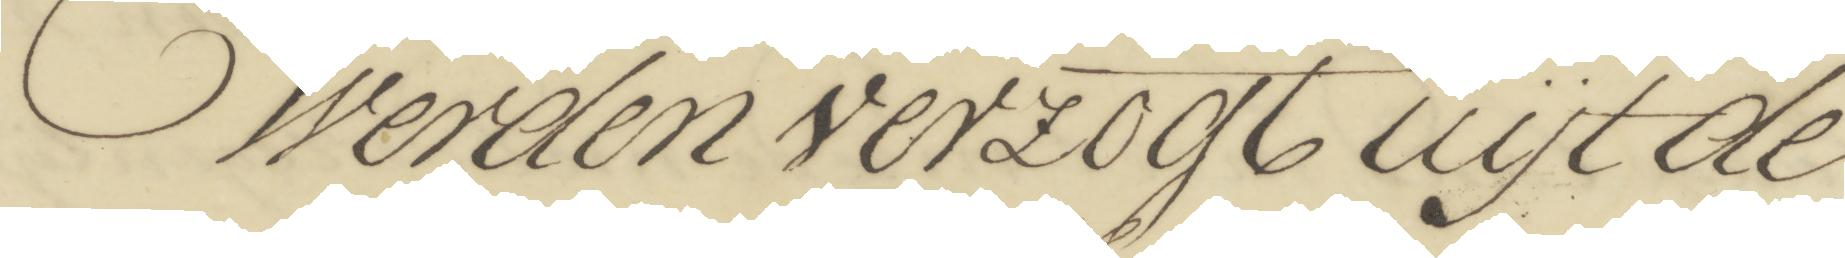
werden verzogt uijt de
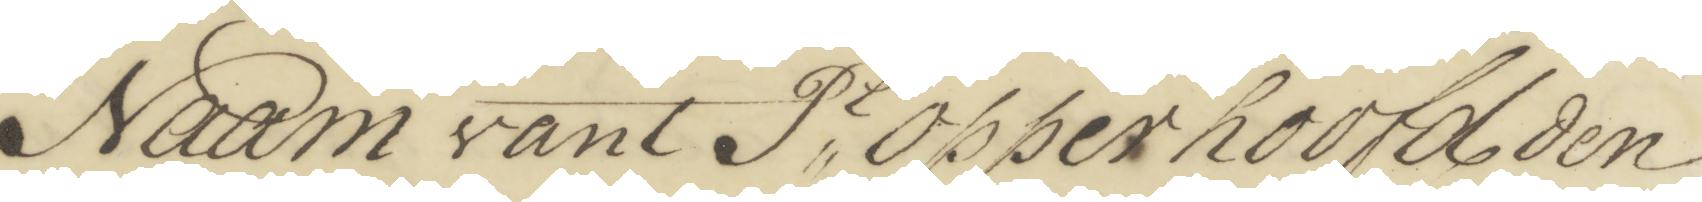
Naam van't P„l opperhoofd den
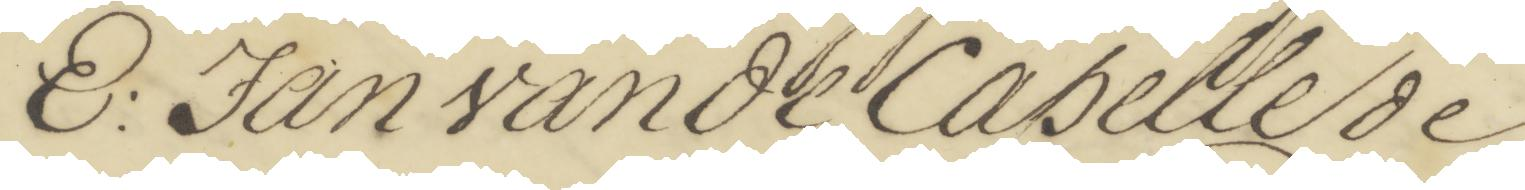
E: Ian van de Capelle de
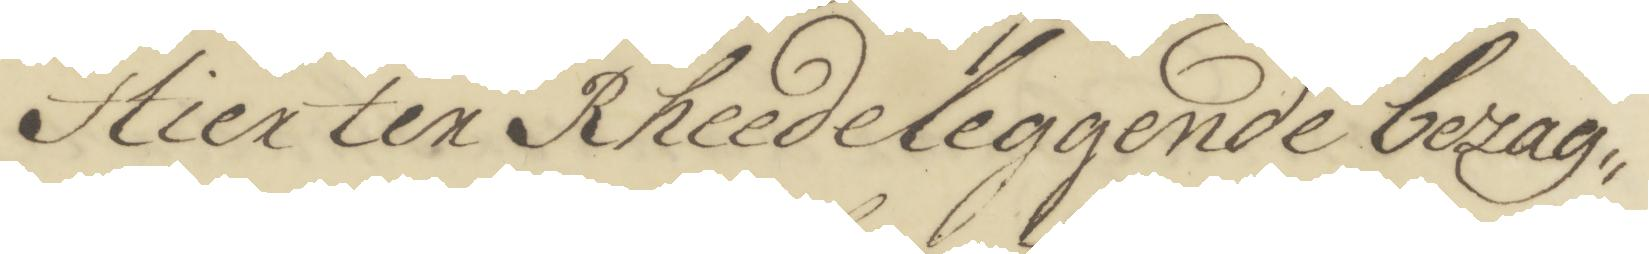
Hier ter Rheedeleggende bezag„
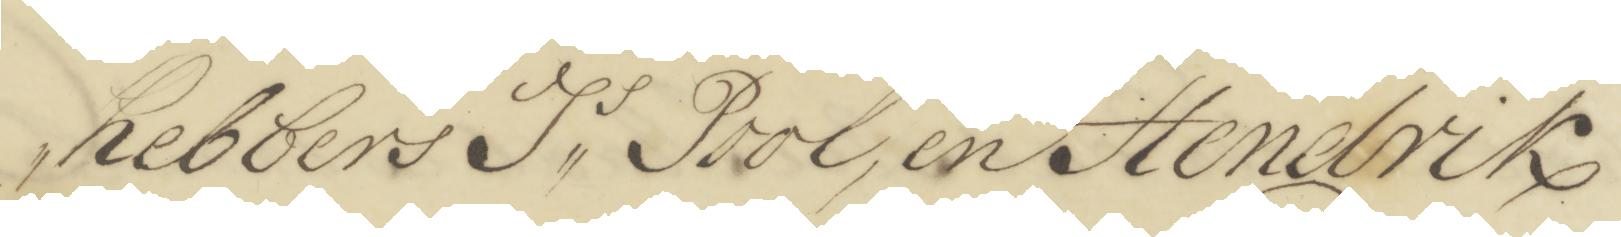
„hebbers I„s Pool, en Hendrik
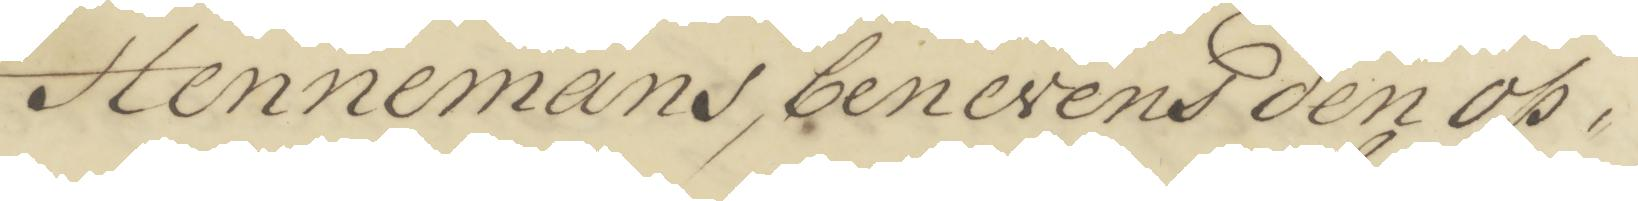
Hennemans, benevens den op„
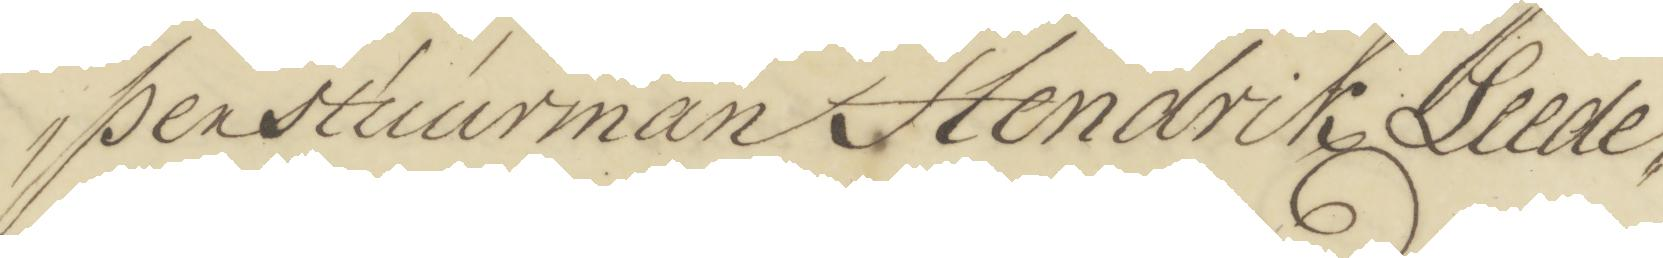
„perstuurman Hendrik Leede
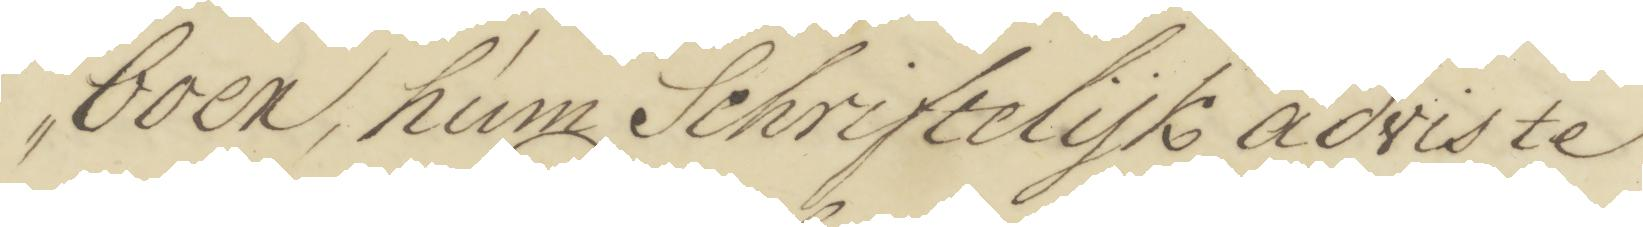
„boer, hum schriftelijk advis te
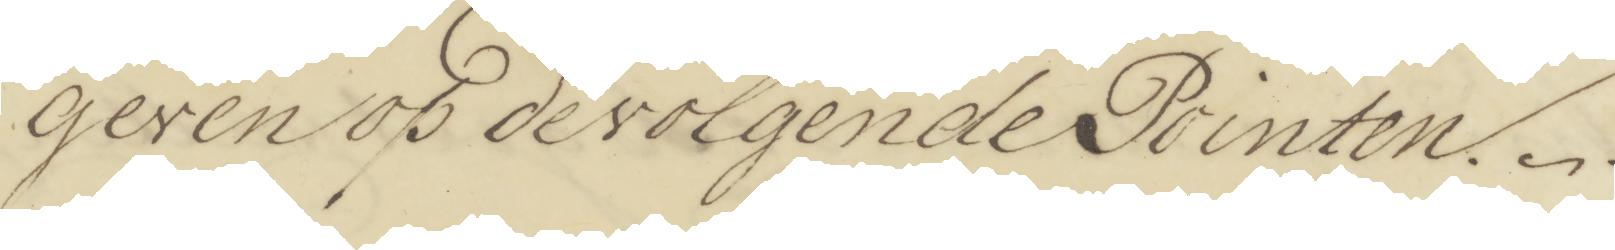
geven op devolgende Pointen. —
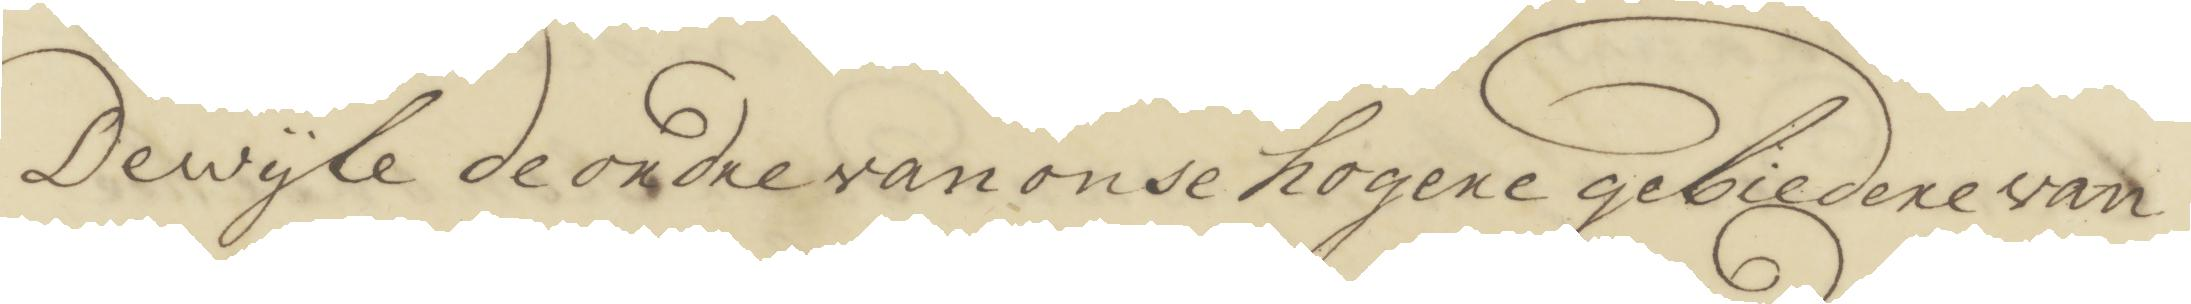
Dewijle de ordre van onse hogere gebiedere van
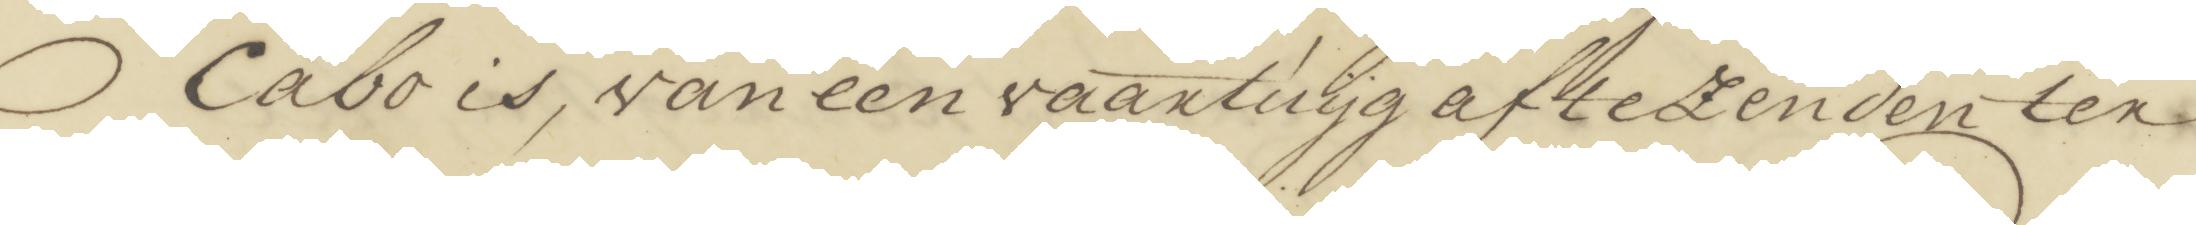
Cabo is, van een vaartuijg aftezenden ter
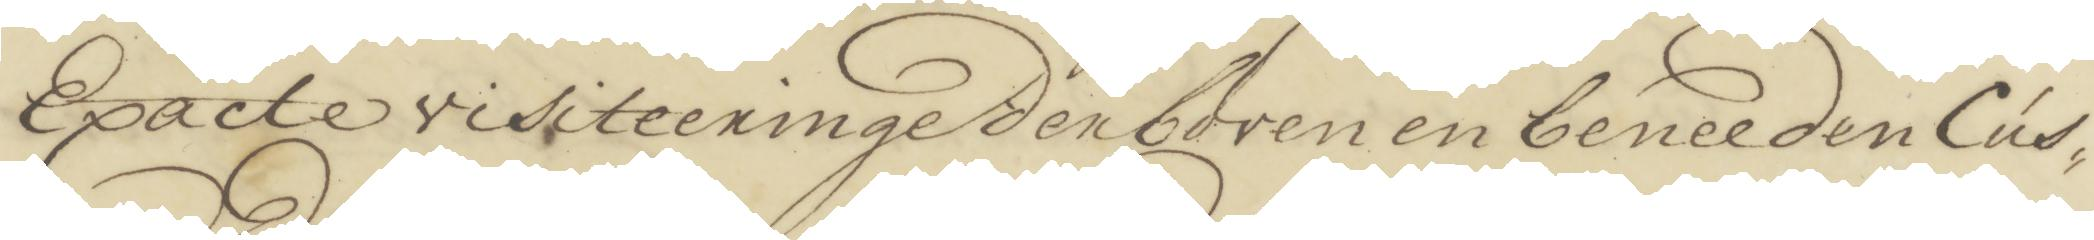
Exacte visiteeringe derboven en beneeden Cus
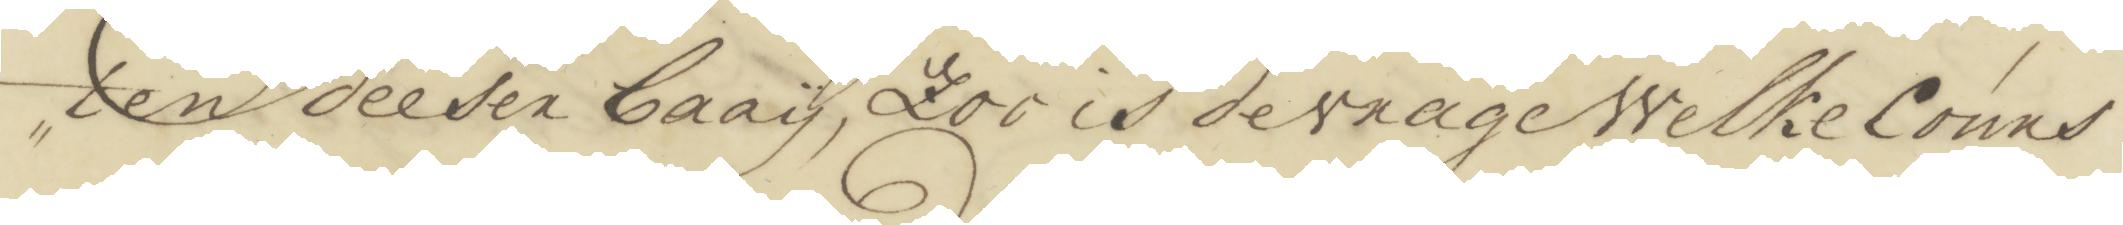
„ten deeser baaij, zoo is devrage welke Cours
